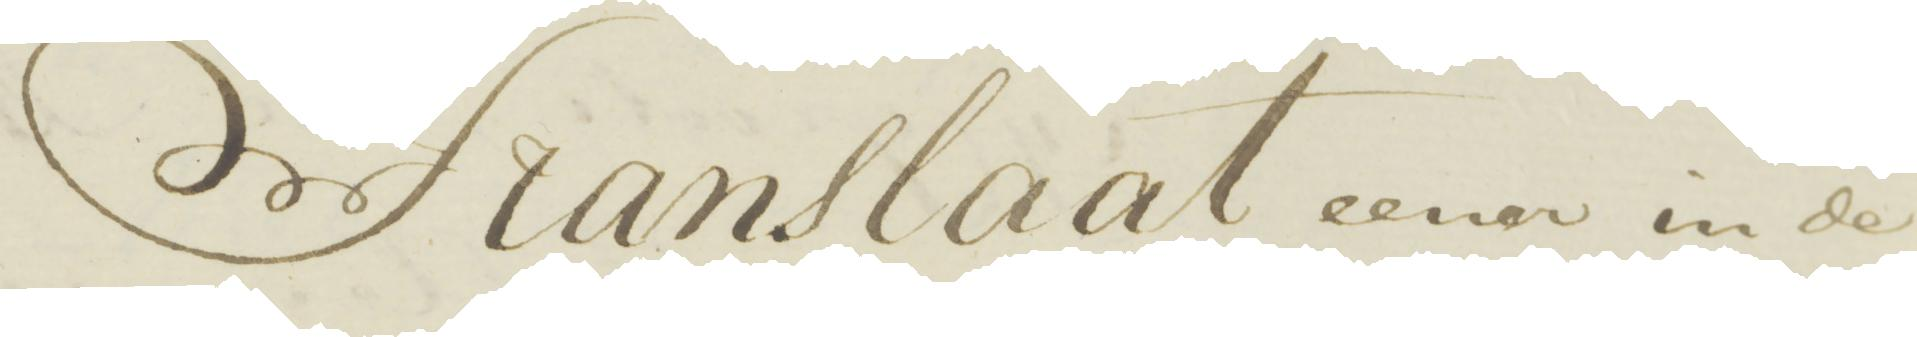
Translaat eener in de
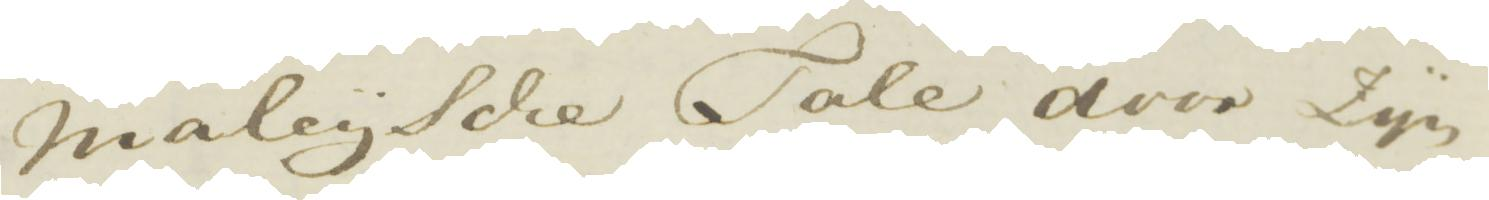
maleijsche Tale door zijn
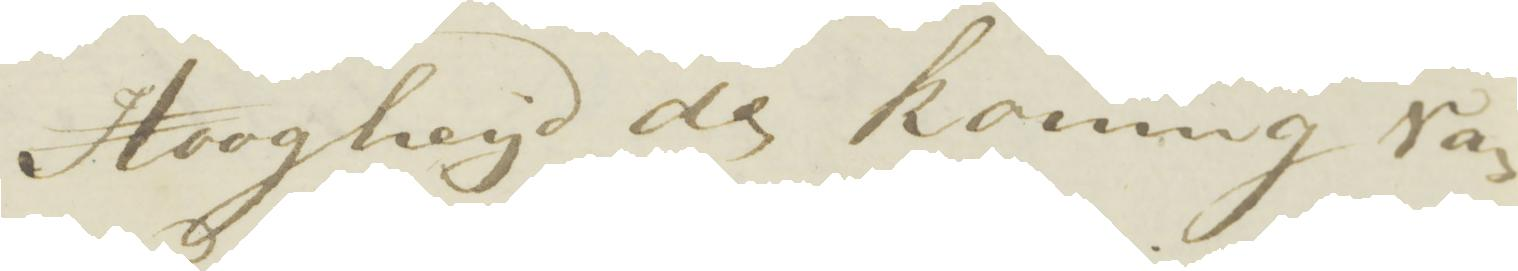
Hoogheijd den Koning van
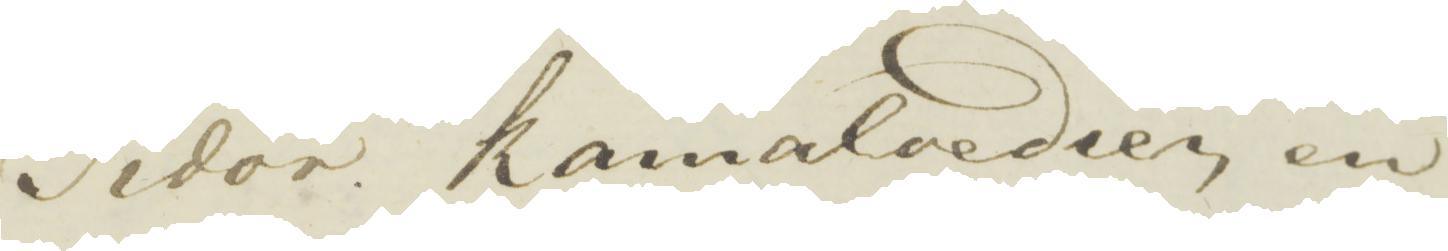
Tidor. Kamaloedien en
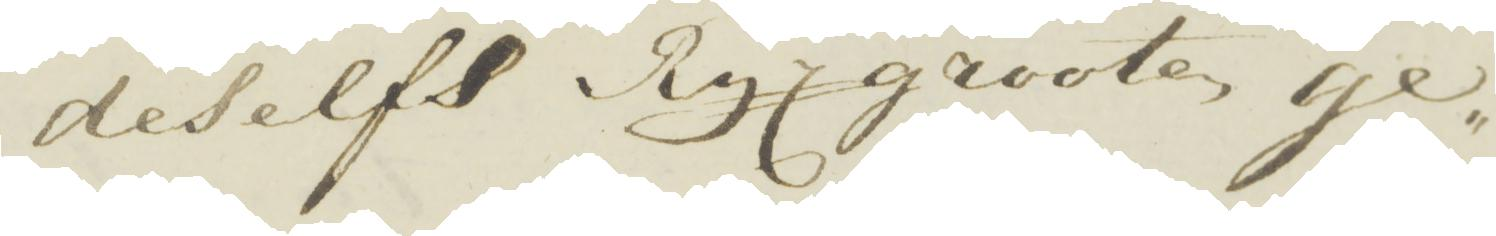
deselfs Rijxgrooten ge„
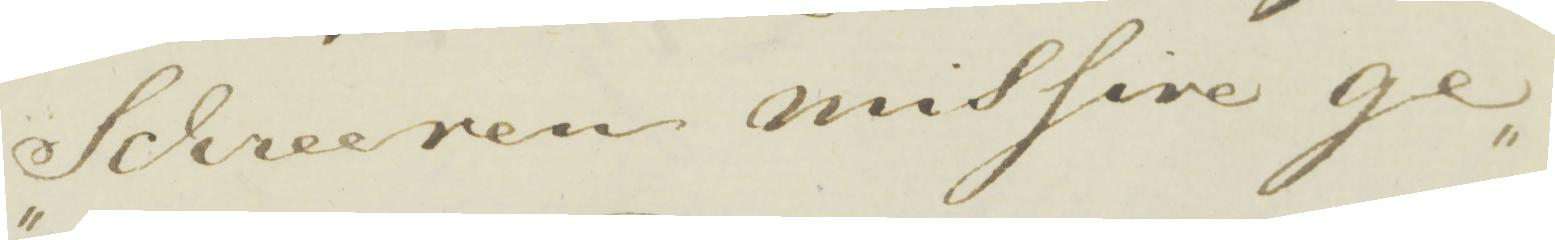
„schreeven missive ge
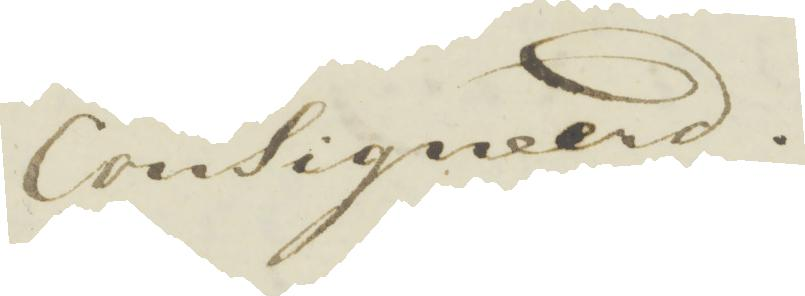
„consigneerd.
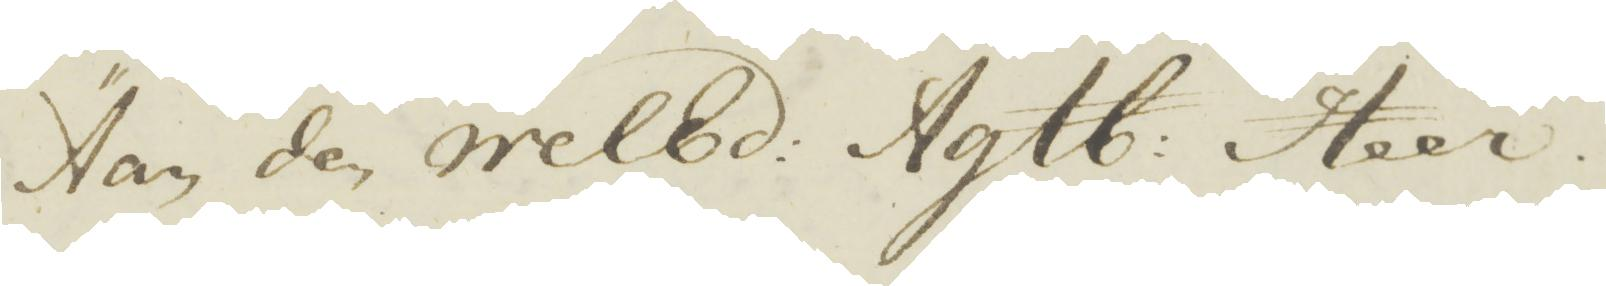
Aan den welEd: Agtb: Heer.
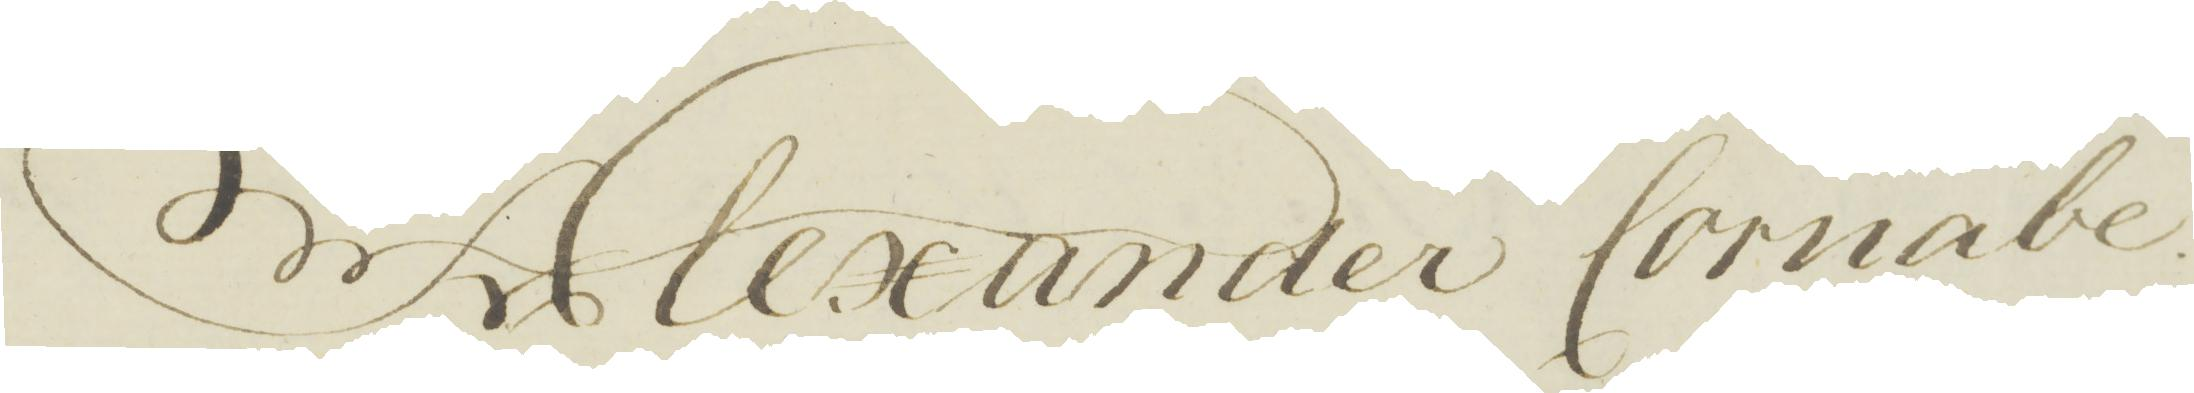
Alexander Cornabe
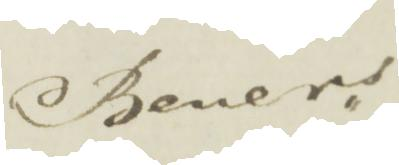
Benev„s
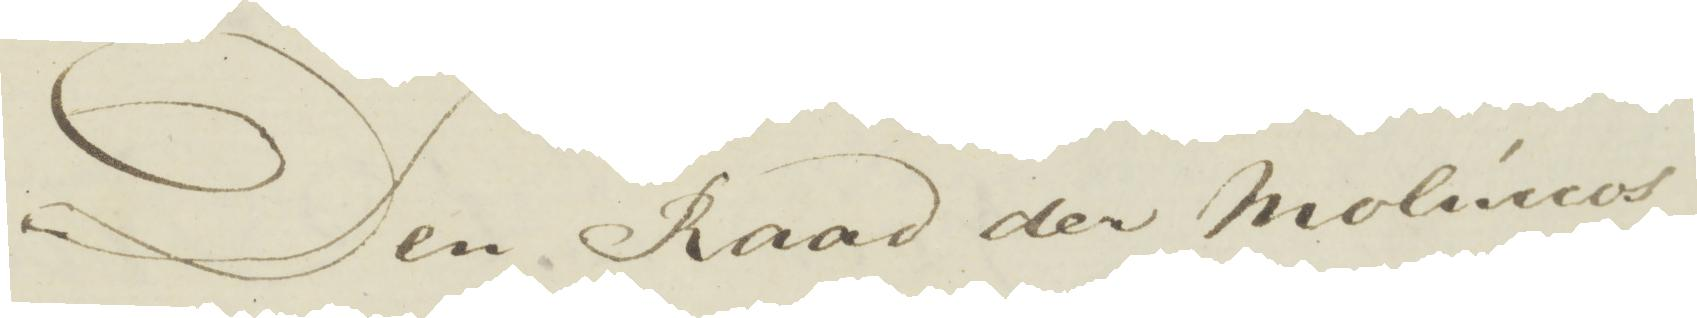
Den Raad der Moluccos
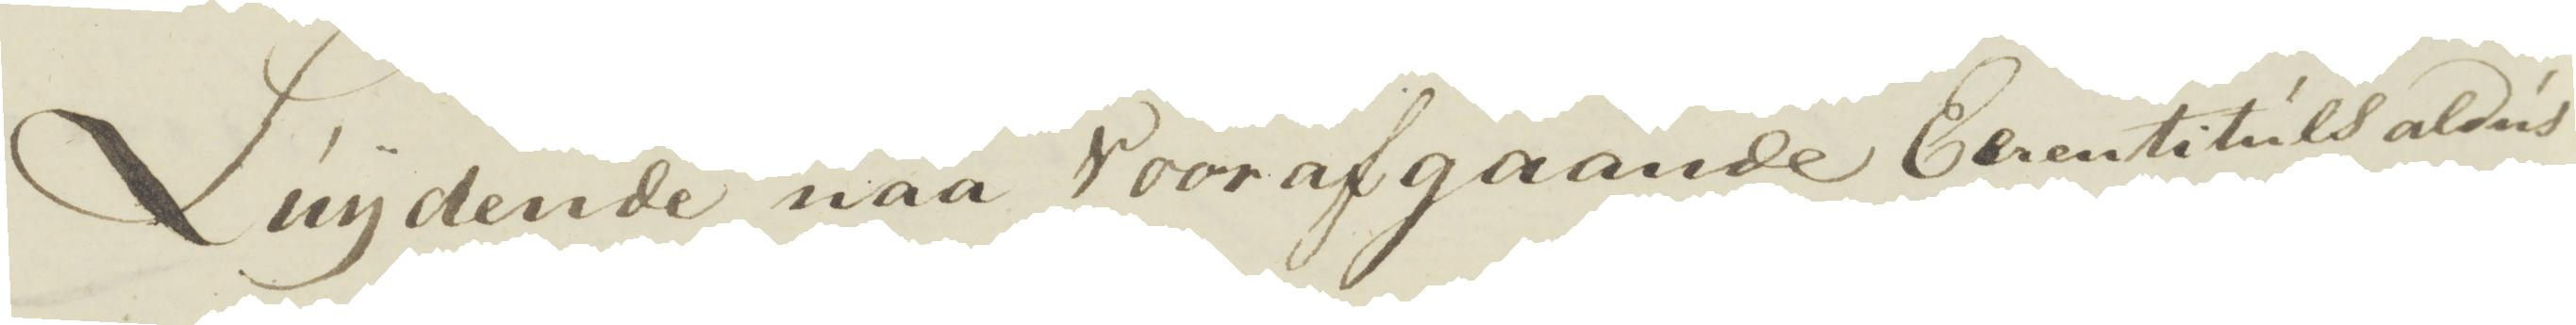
Luijdende naa Voorafgaande Eerentituls aldus
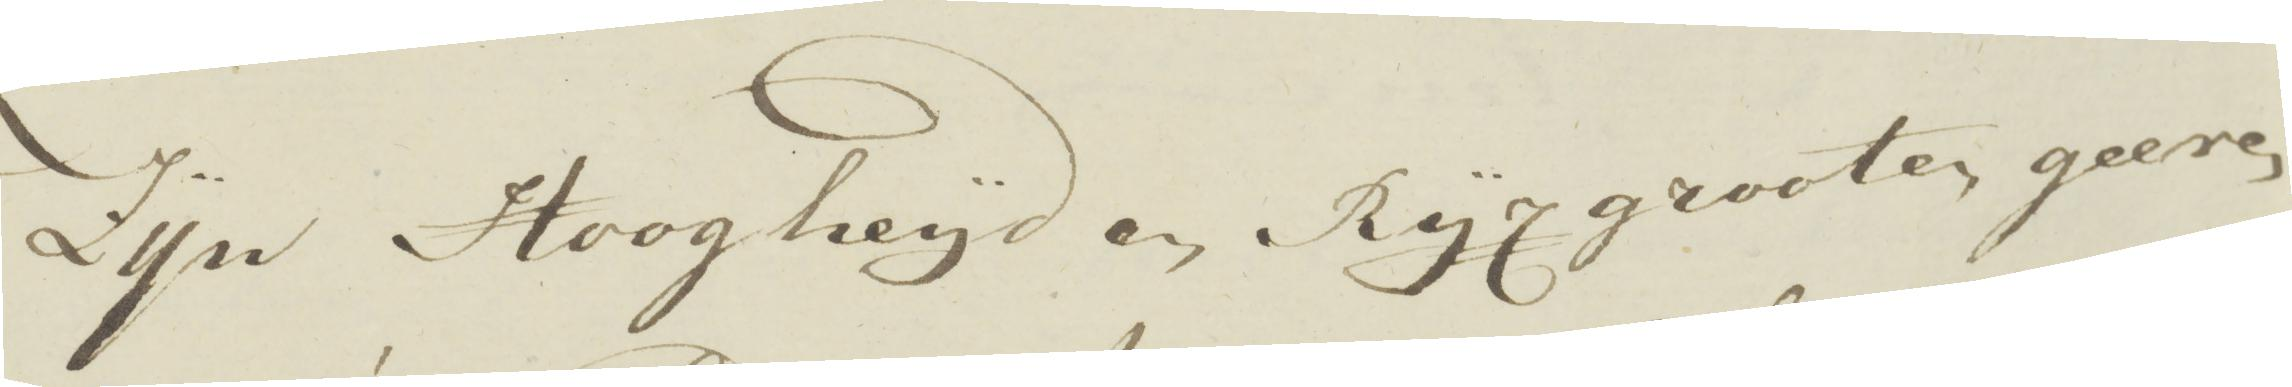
Zijn Hoogheijd en Rijxgrooten geeven
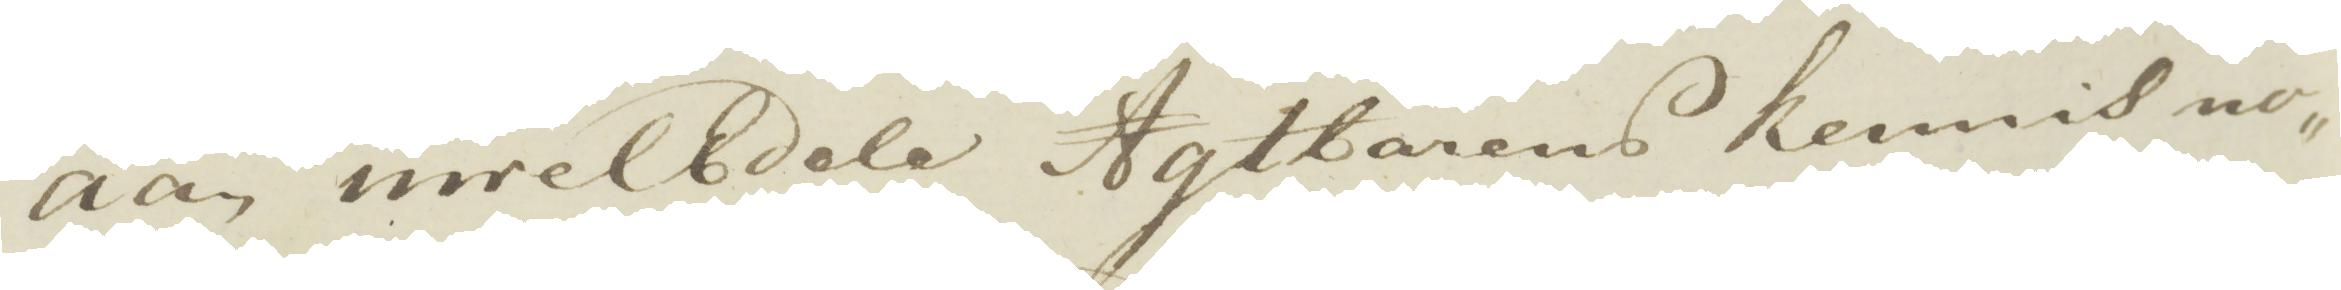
aan uwelEdele Agtbarens kennis no„
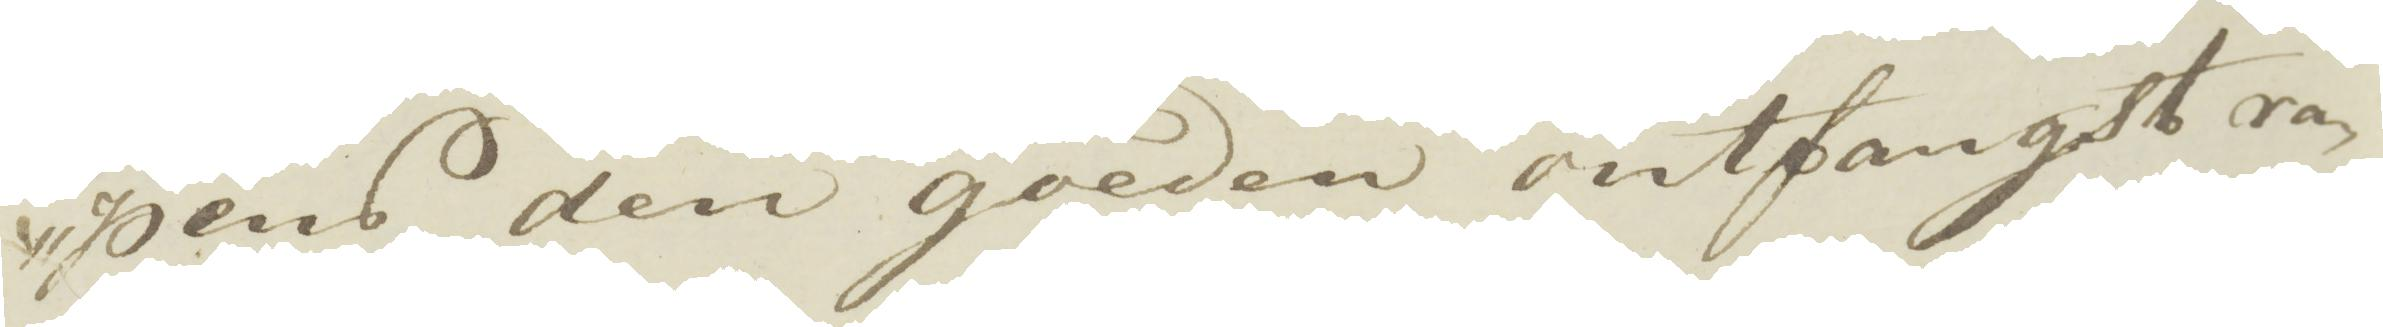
„pens den goeden ontfangst van
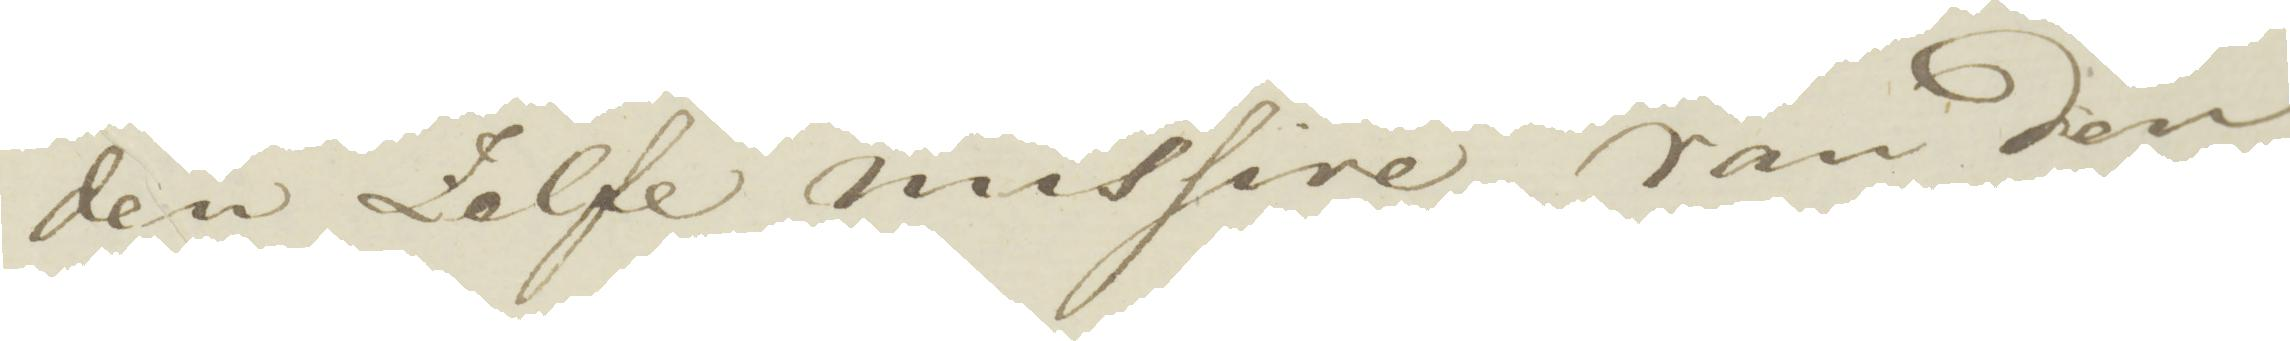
den zelfe missive, van den
